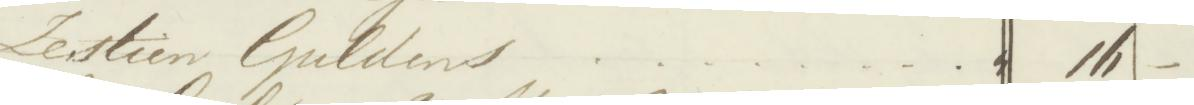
Zestien Guldens . . . . . . . . „ 16 —
